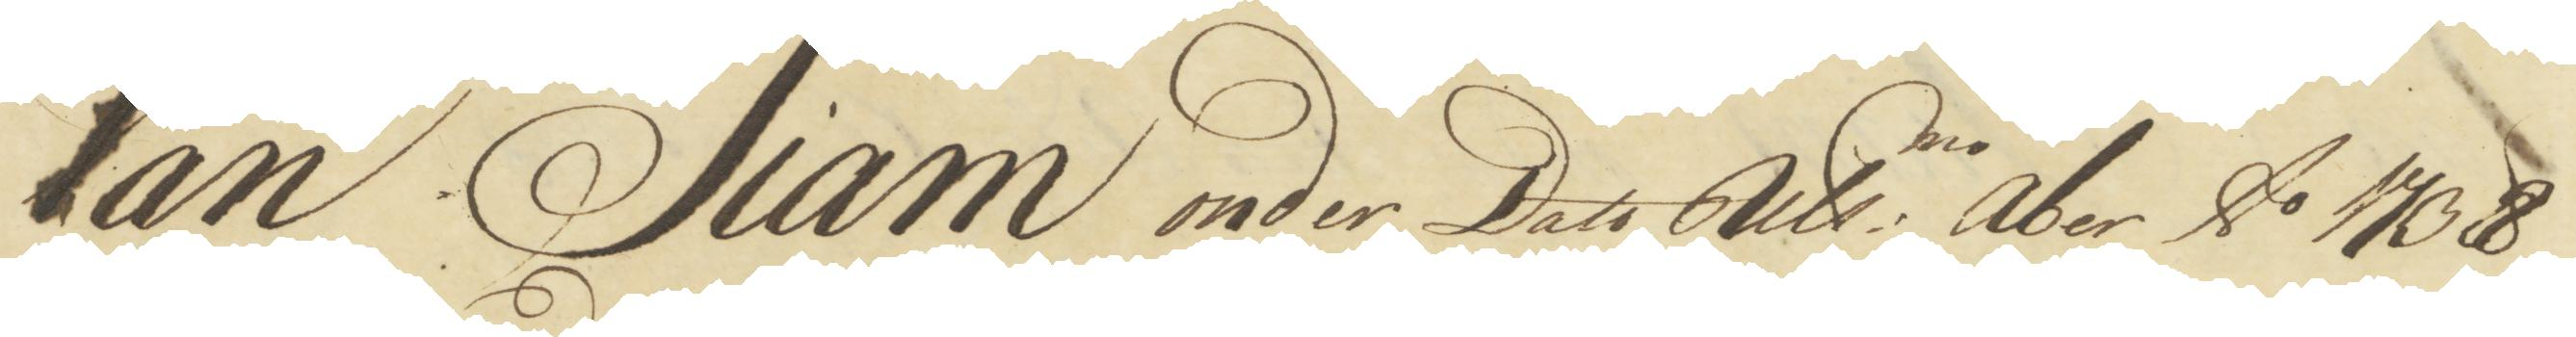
Van Siam onder Dato ult:mo aber Ao 1738
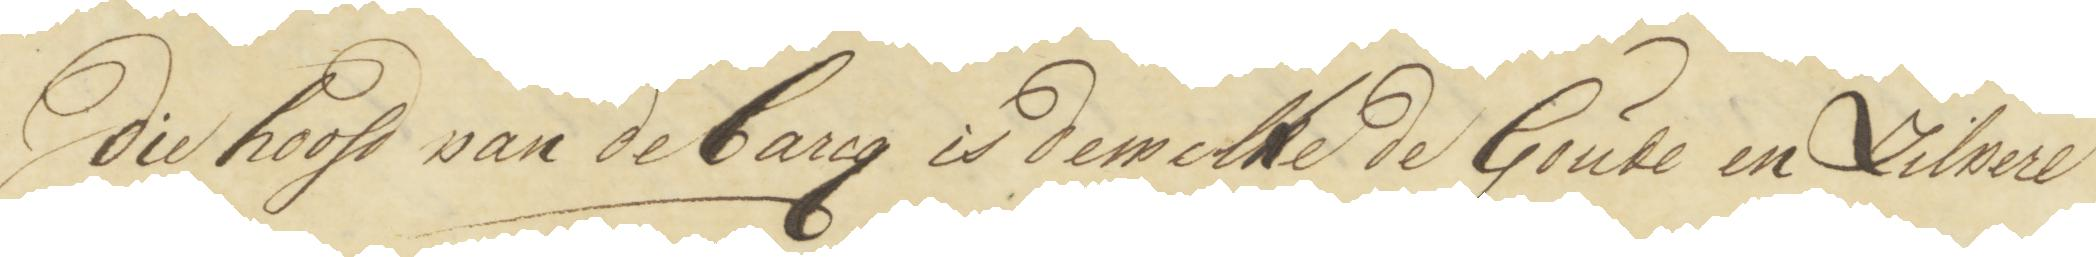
die hoofd van de barcq is dewelke de Goute en Zilvere
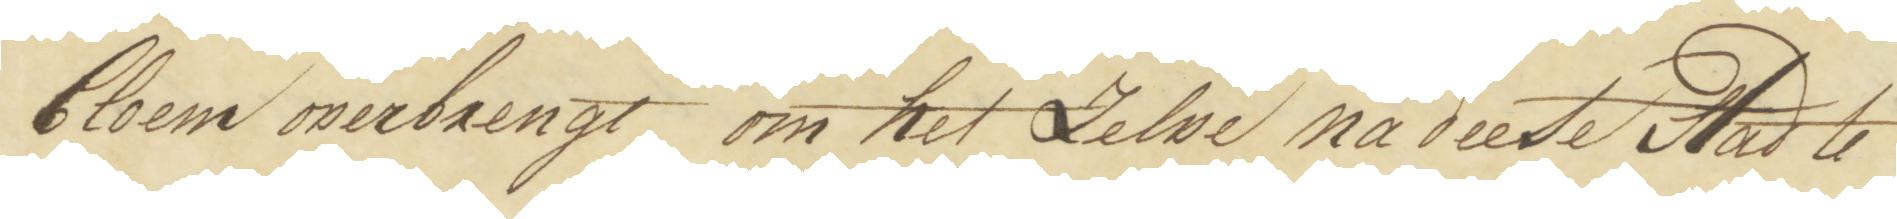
bloem overbrengt om het zelve na deese stad te
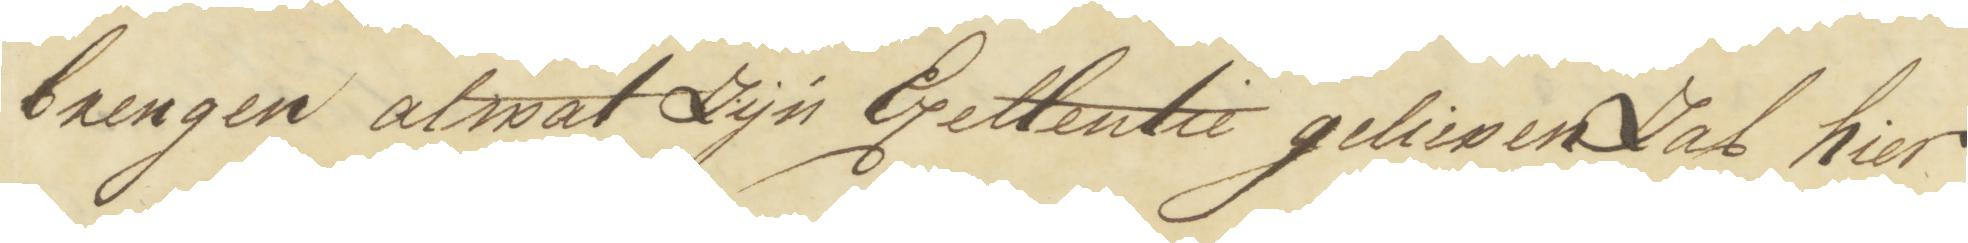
brengen alwat zijn Exellentie gelieven zal hier
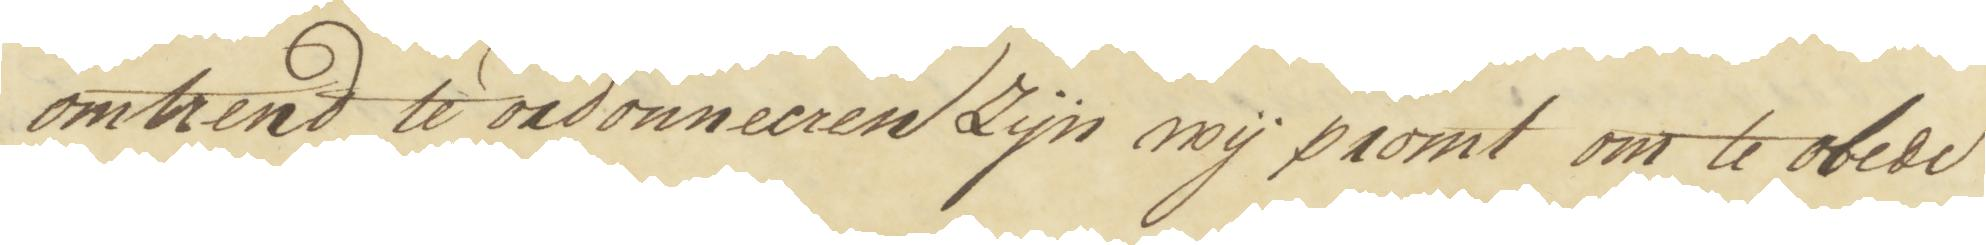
omtrend te ordonneeren zijn wij promt om te obede
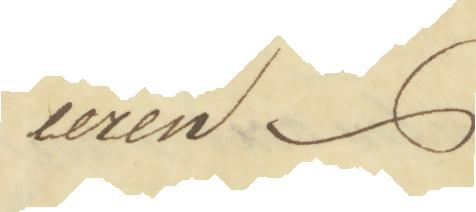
eeren -
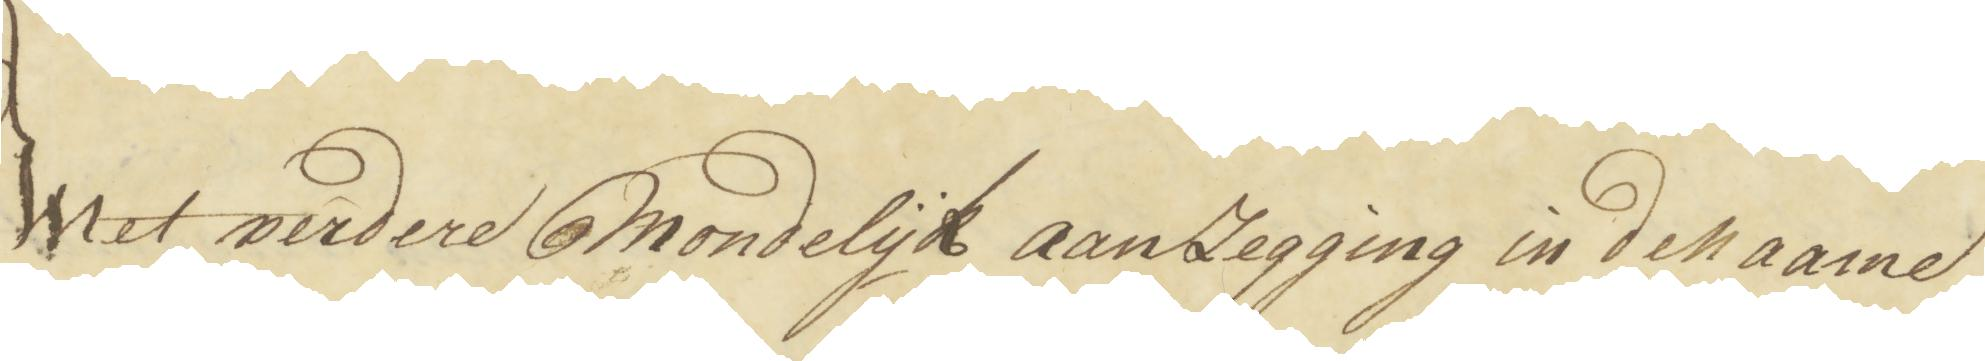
Wet verdere mondelijk aanzegging in de naame
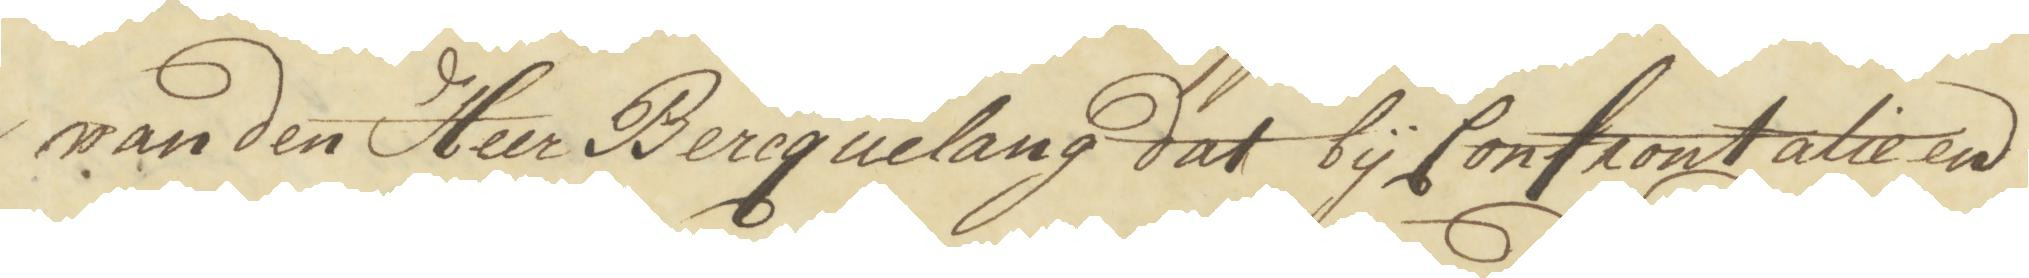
van den Heer Bercquelang dat bij Confrontatie en
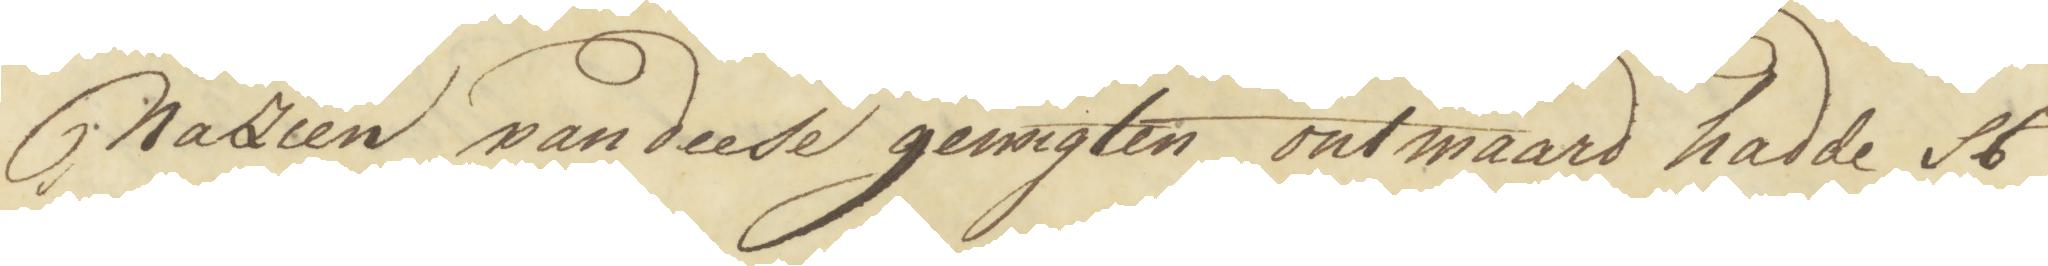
nazien van deese gewigten ontwaard hadde s E
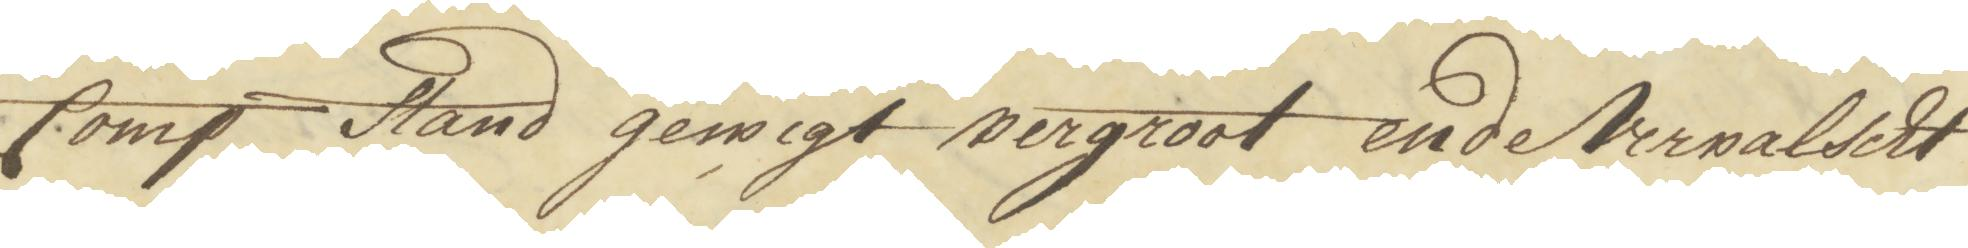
Comp stand gewigt vergroot ende vervalscht
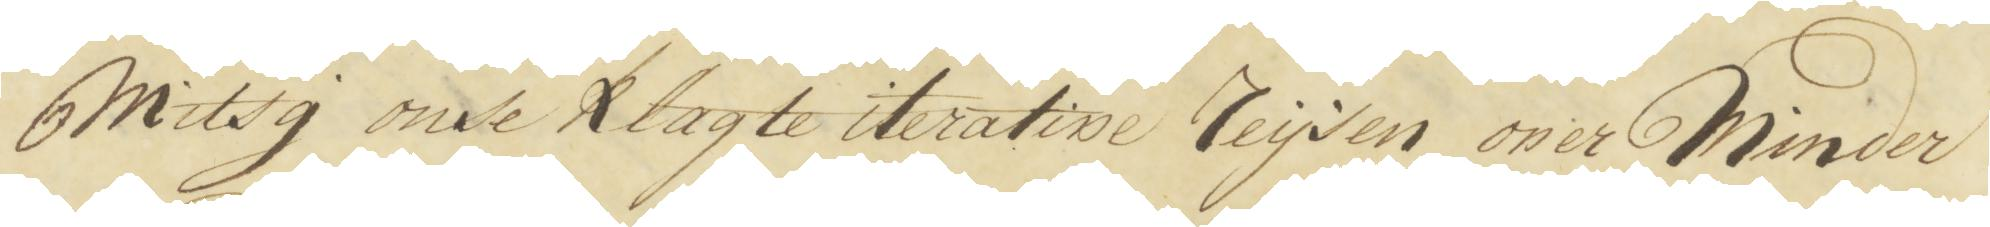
mitsg: onse klagte iterative reijsen over Minder
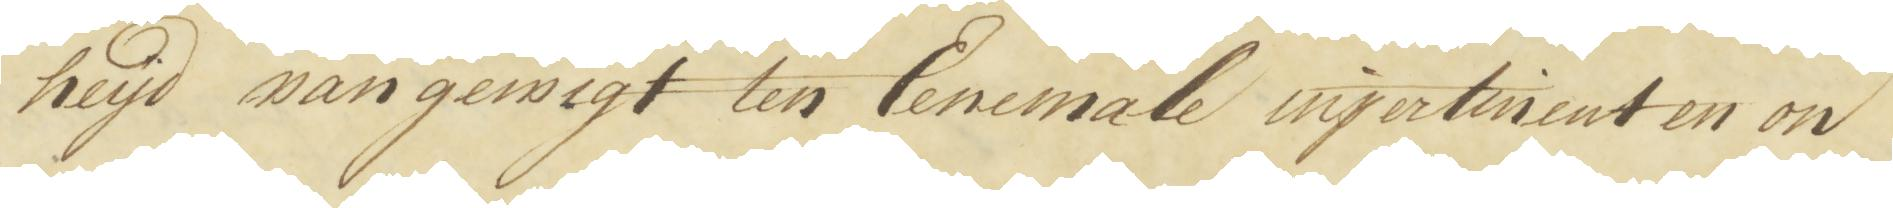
heijd van gewigt ten Eenemale inpertinent en on
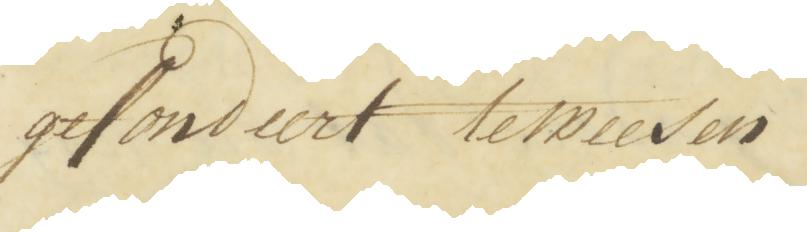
gefondeert teweesen
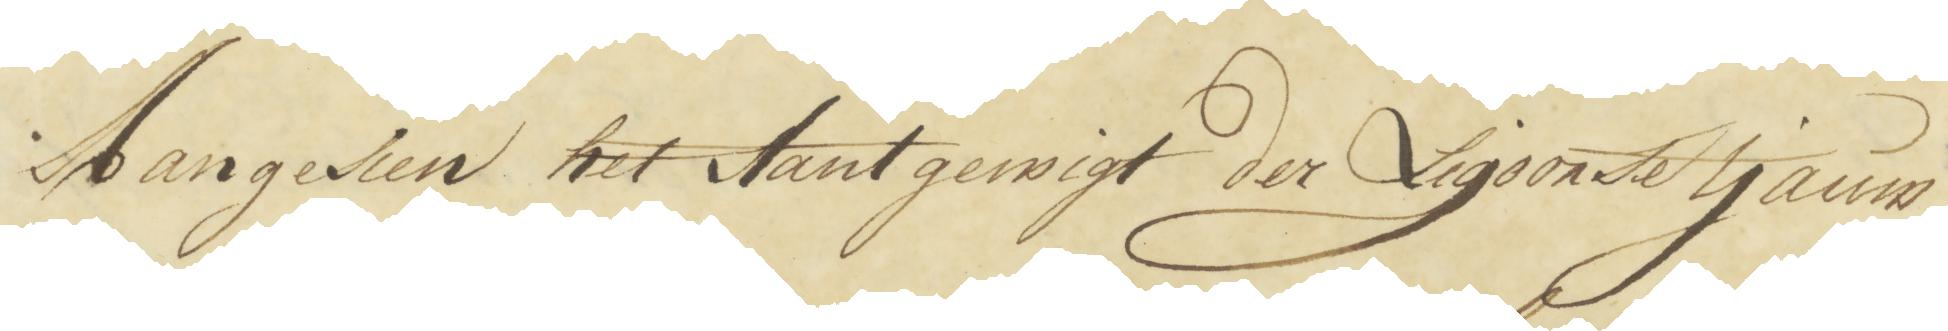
Aangesien het Aant gewigt der Ligoorse tjauw
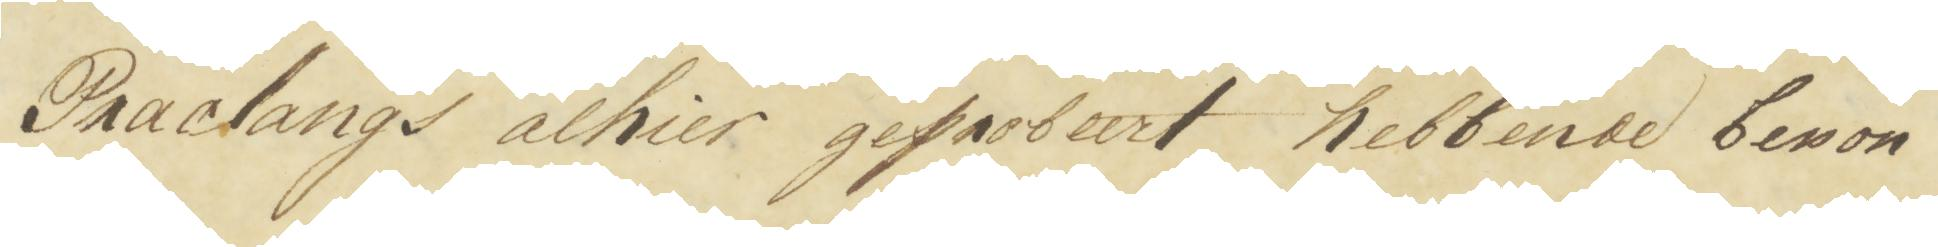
Praelangs alhier geprobeert hebbende bevon
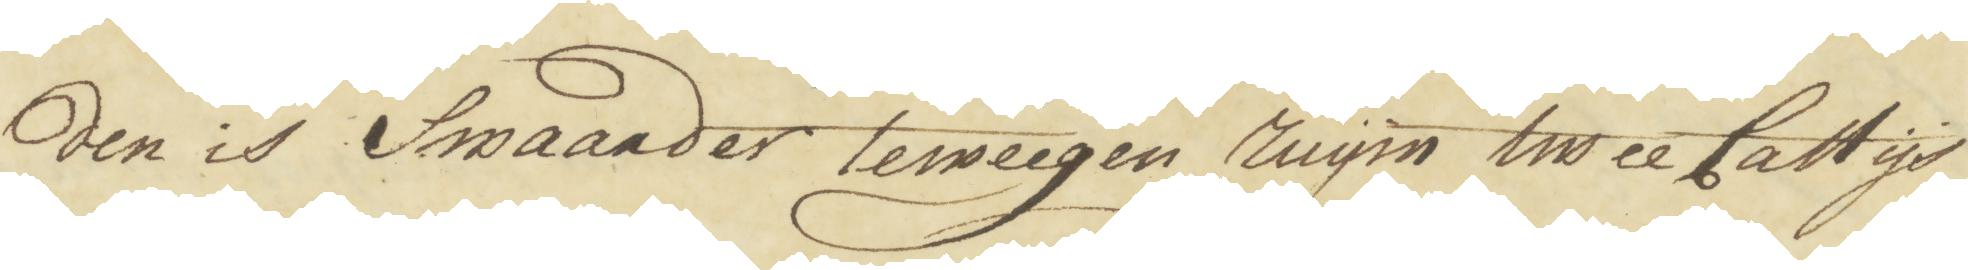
den is swaarder teweegen ruijm twee cattijs
